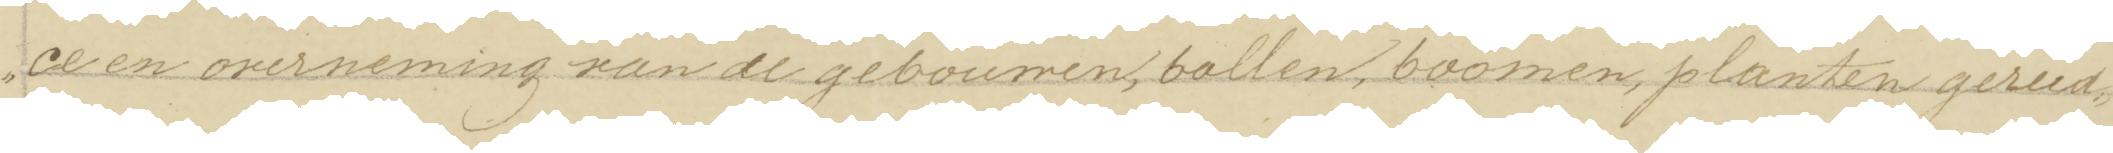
„ce en overneming van de gebouwen, bollen, boomen, planten gereed„
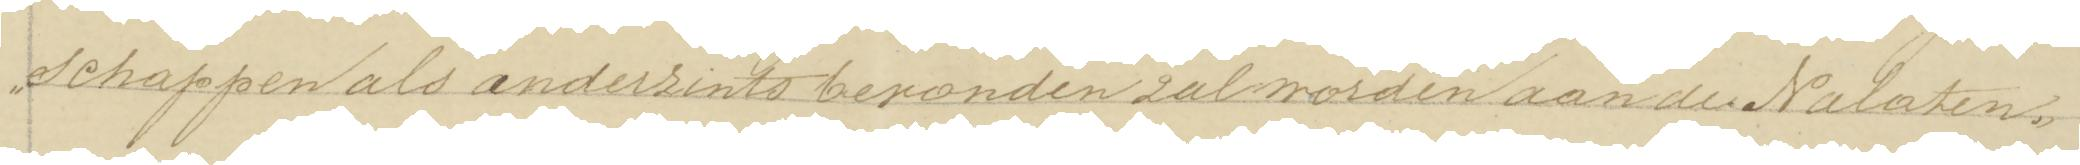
„schappen als anderzints bevonden zal worden aan de Nalaten„
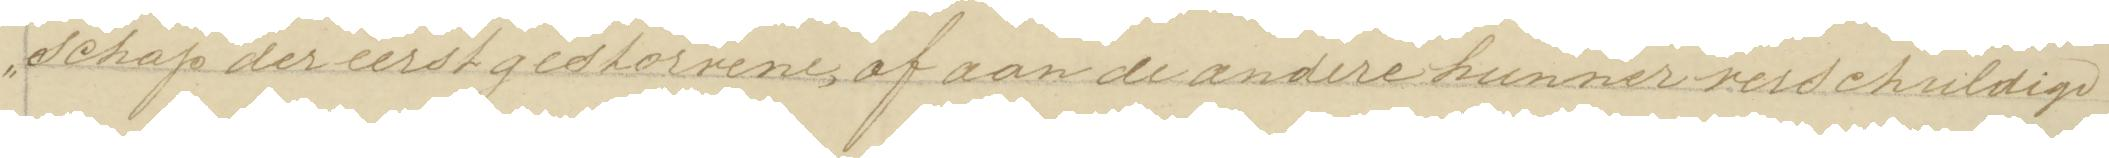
„schap der eerst gestorvene, of aan de andere hunner verschuldigd
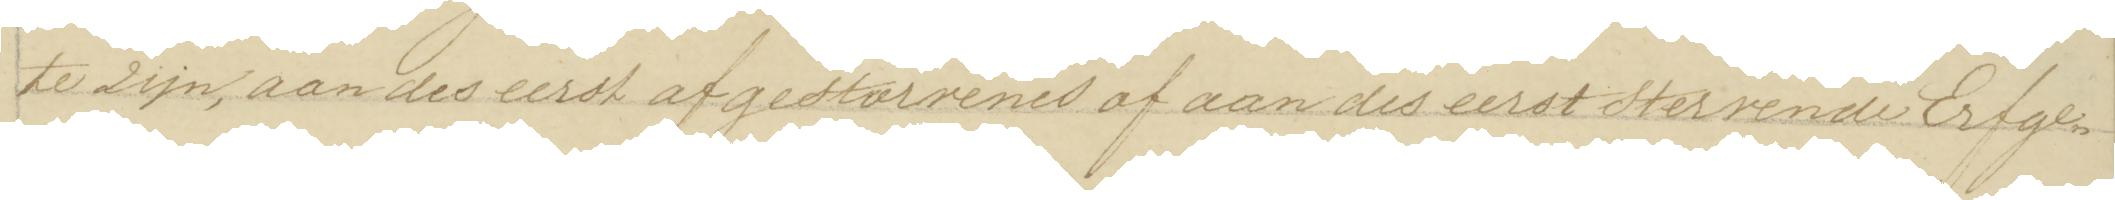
te zijn, aan des eerst afgestorvene of aan des eerst stervende Erfge„
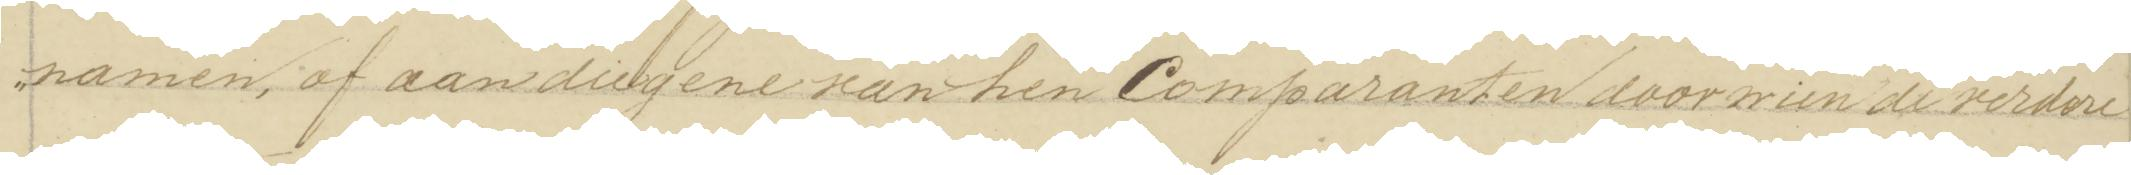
„namen, of aan diegene van hen Comparanten door wien de verdere
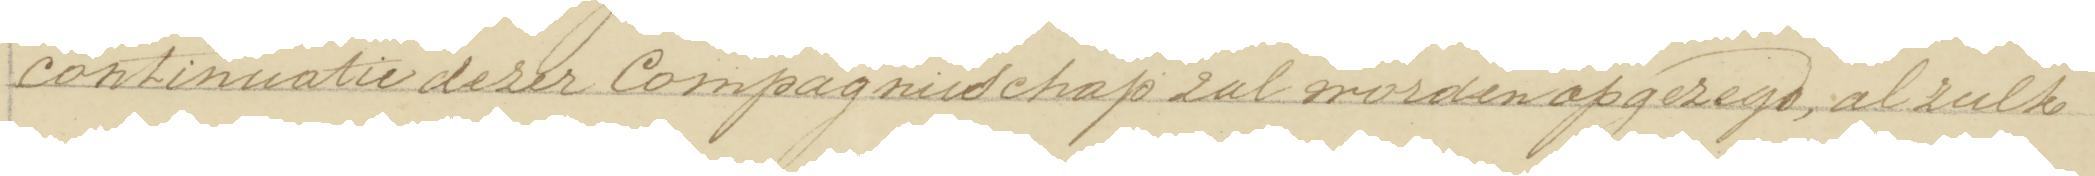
continuatie dezer Compagnieschap zal worden opgezegd, al zulke
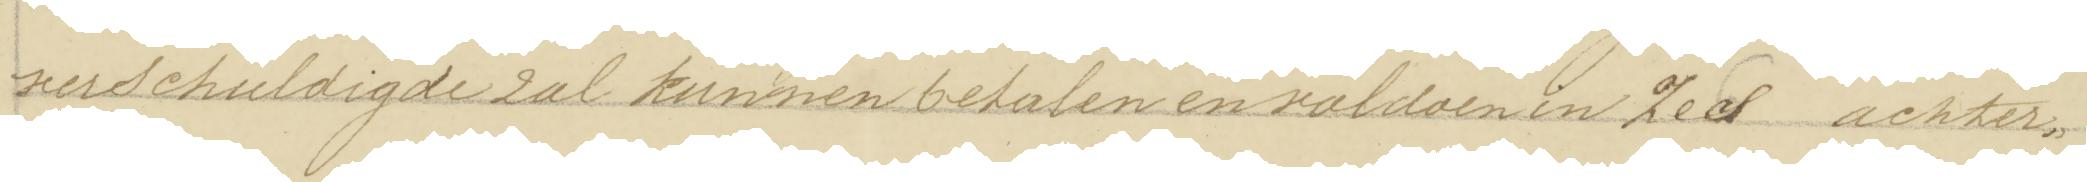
verschuldigde zal kunnen betalen en voldoen in Zes achter„
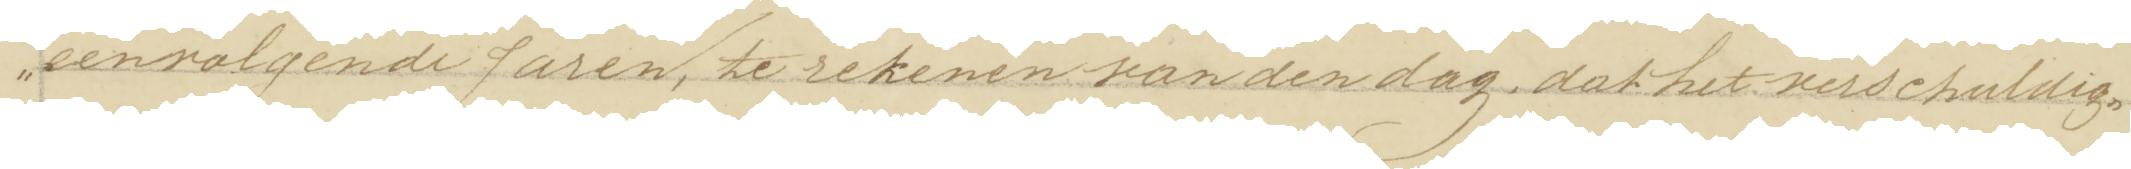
„eenvolgende Jaren, te rekenen van den dag, dat het verschuldig„
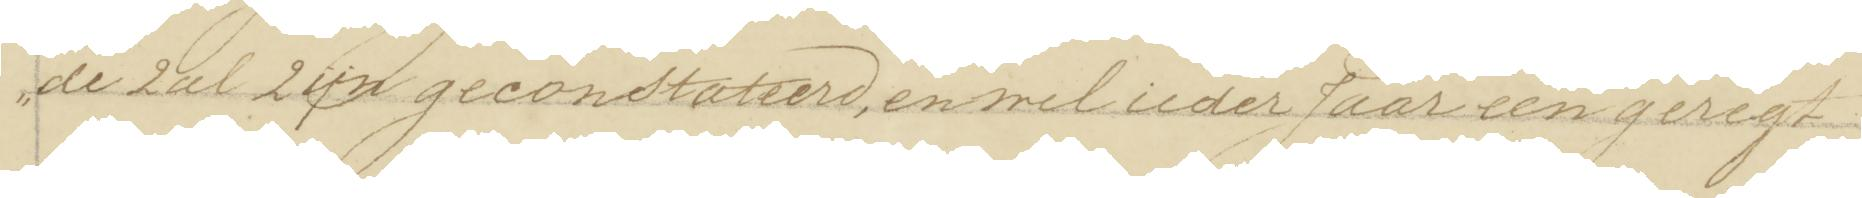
„de zal zijn geconstateerd, en wel ieder Jaar een geregt
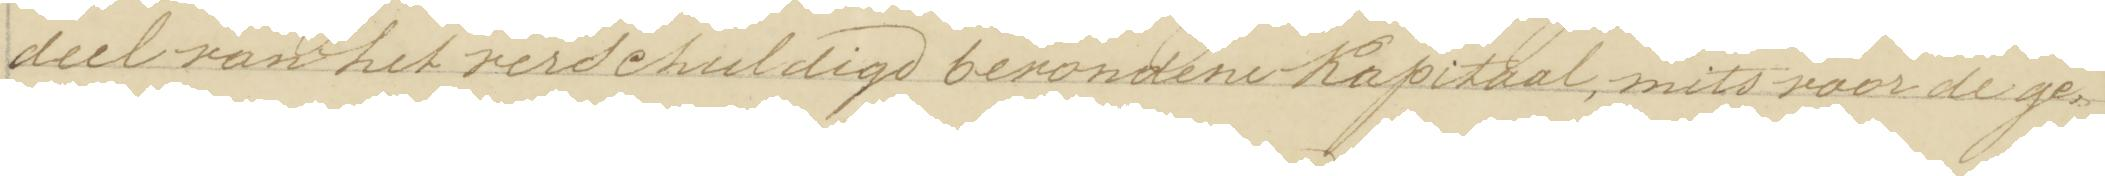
deel van het verschuldigd bevondene Kapitaal, mits voor de ge„
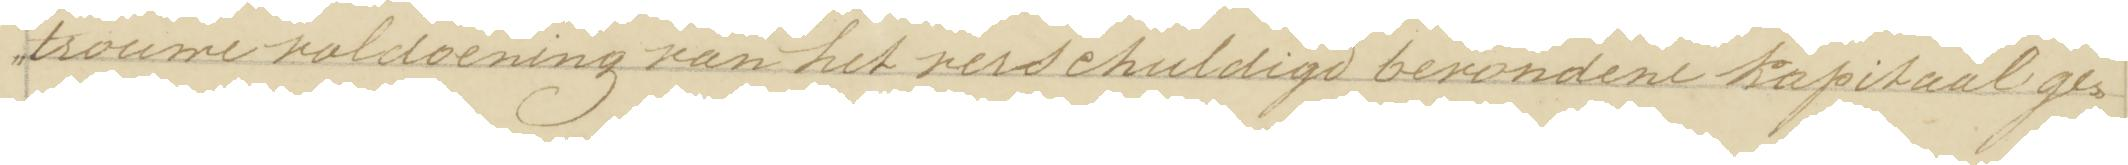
„trouwe voldoening van het verschuldigd bevondene kapitaal ge
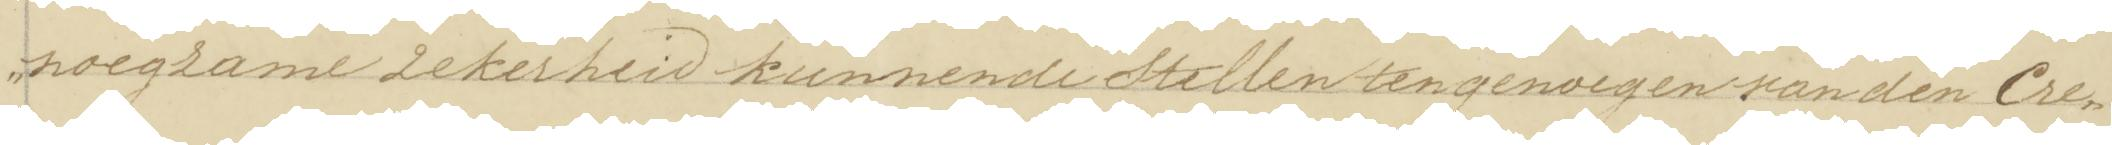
„noegzame zekerheid kunnende stellen ten genoegen van den Cre„
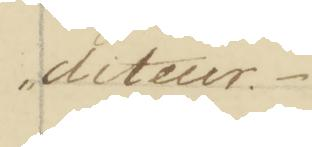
„diteur.
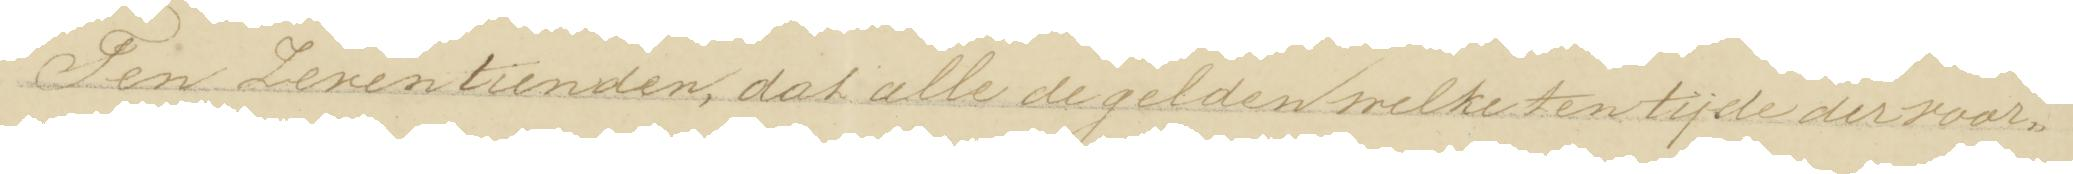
Ten Zeventienden, dat alle de gelden welke ten tijde der voor„
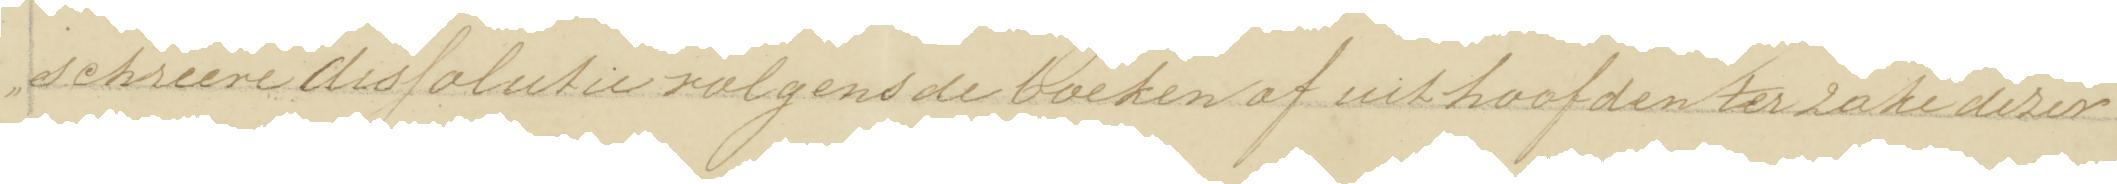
„schreeve dissolutie volgens de boeken of uithoofden ter zake dezer
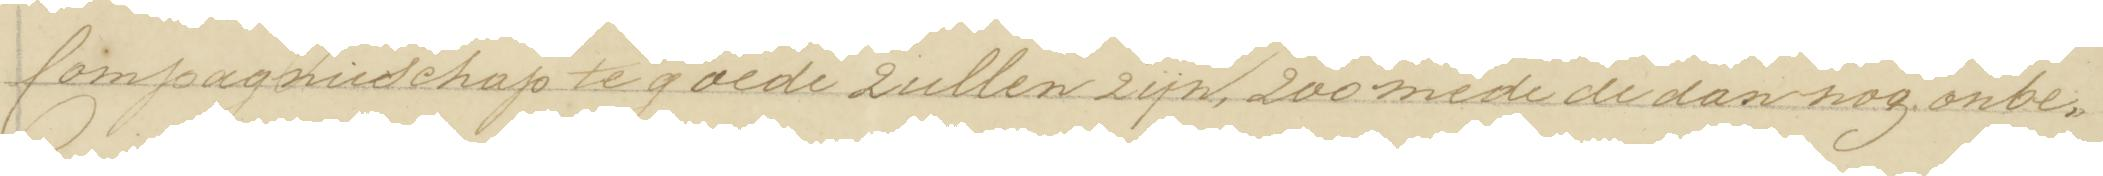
Compagnieschap te goede zullen zijn, zoo mede de dan nog onbe„
